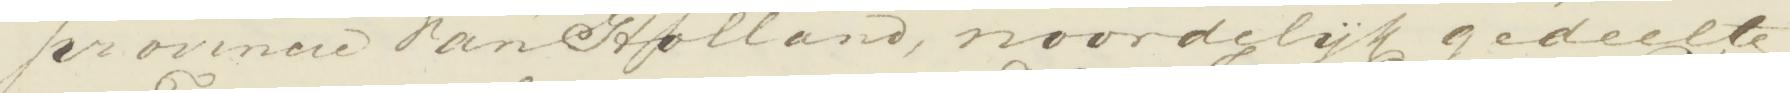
provincie van Holland, noordelijk gedeelte
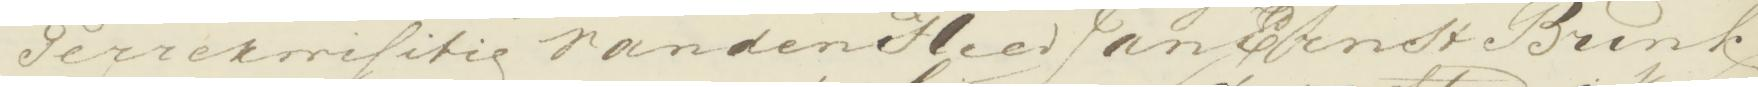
Ter rekwisitie van den Heer Jan Ernst Brink
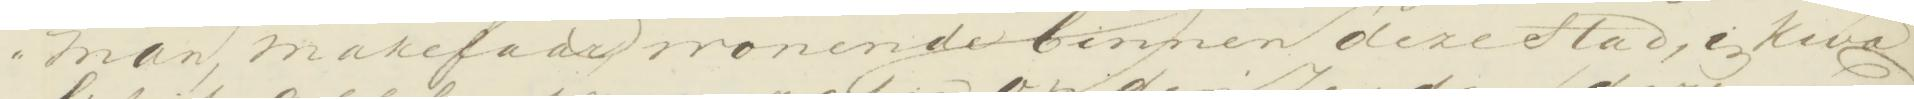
„man makelaar wonende binnen deze stad, in kwa
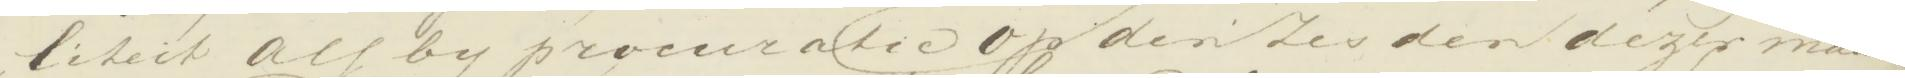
„liteit als by procuratie op den zes den dezer maand
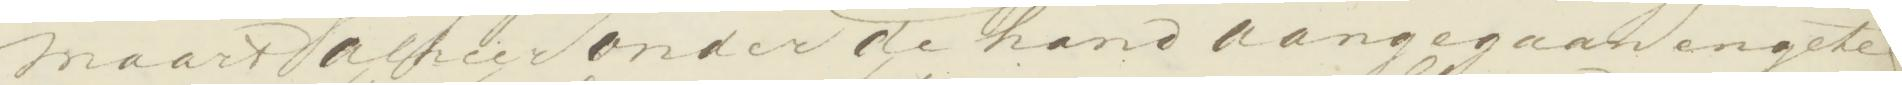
maart alhier onder de hand aangegaan en getee
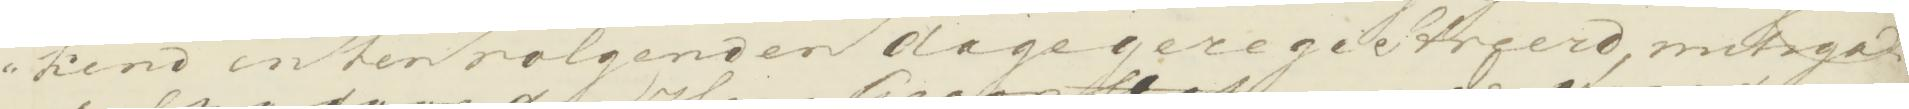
„kend en ten volgenden dage geregistreerd, mitsga„
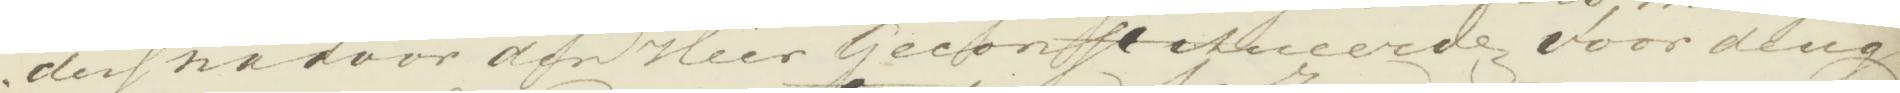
„ders na door den Heer Geconstitueerde voor deug
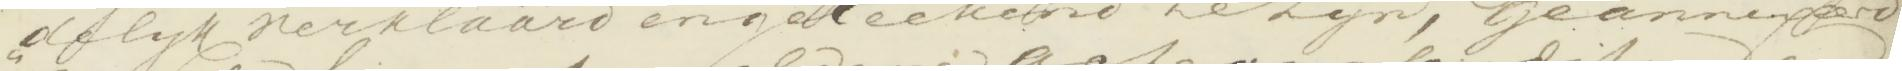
„delyk verklaard en geteekend te zyn, geannexeerd
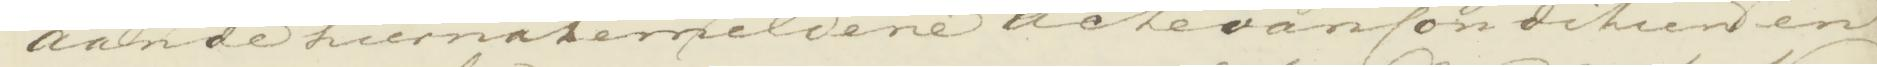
aan de hiernatemeldene acte van conditien en
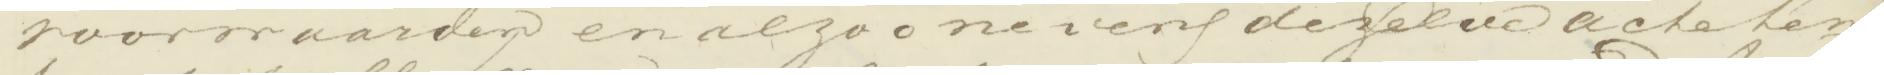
voorwaarden en alzoo nevens dezelve acte ten
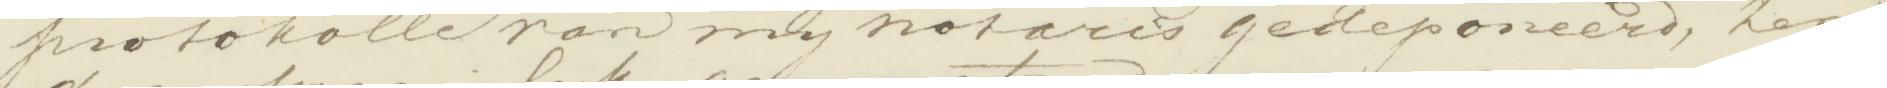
protokolle van my notaris gedeponeerd, ter
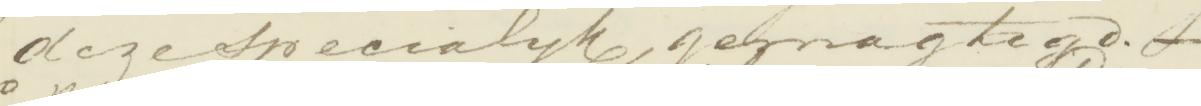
deze specialyk, gemagtigd.—
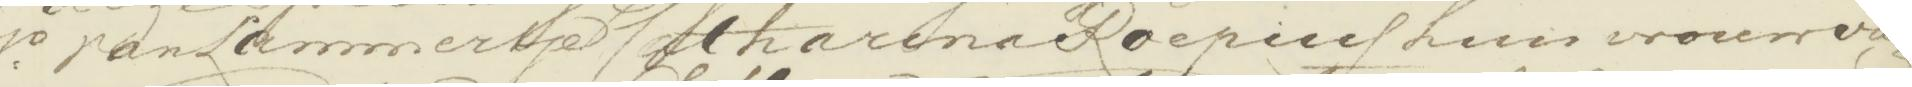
V:o van Lammertje Catharina Roepius huisvrouw van
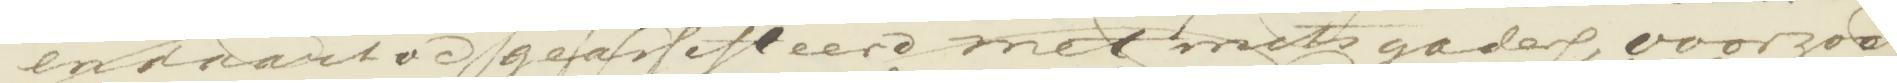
en daartoe geassitteerd met mitsgaders, voorzoo
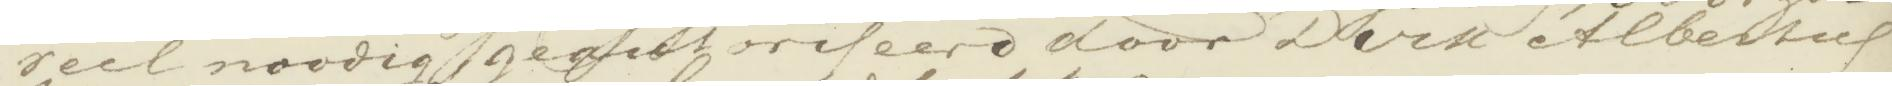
veel noodig geautoriseerd door Dirk Albertus
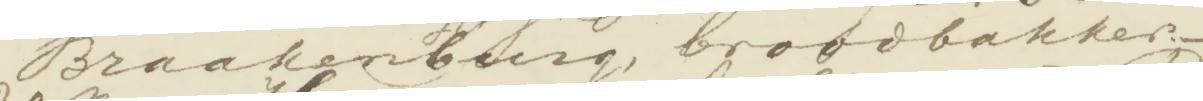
Braakenburg, broodbakker
